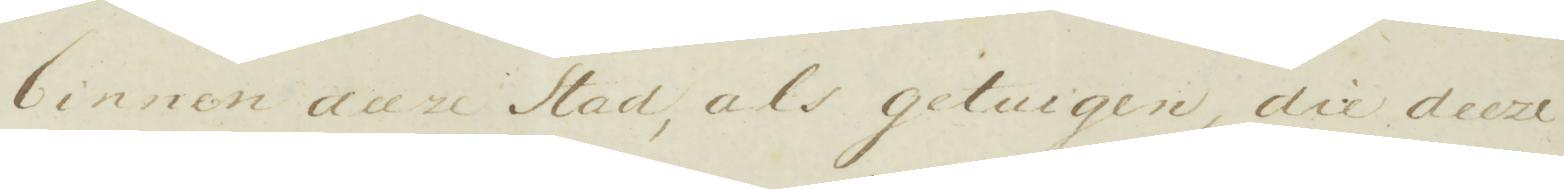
binnen deeze stad, als getuigen, die deeze
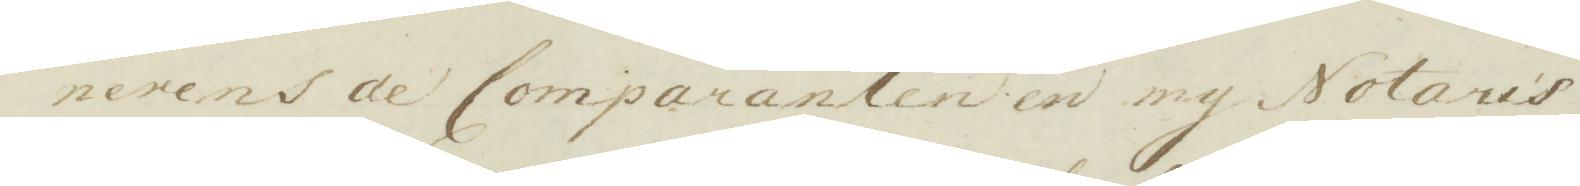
nevens de Comparanten en my Notaris
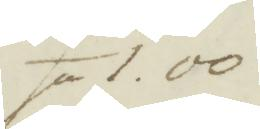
ƒ 1.00
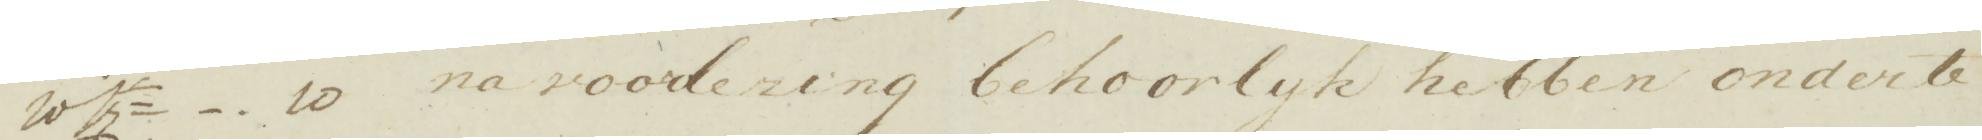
20 /c=t -. 10 na voorlezing behoorlyk hebben onder te
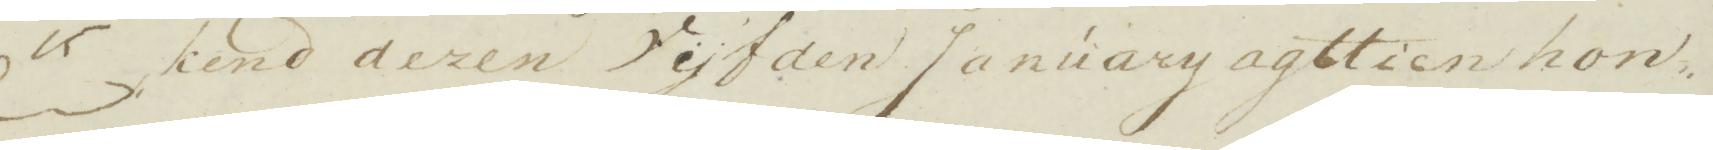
kend dezen Vijfden January agttien hon„
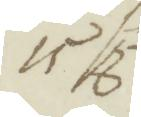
15 /c=t _.15
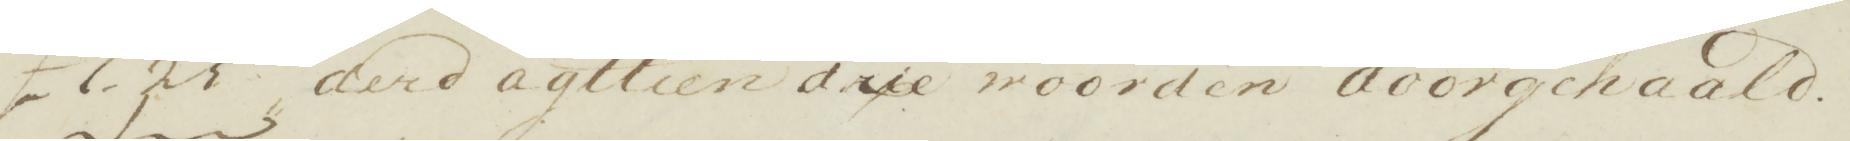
ƒ1.25 „derd agttien drie woorden doorgehaald.
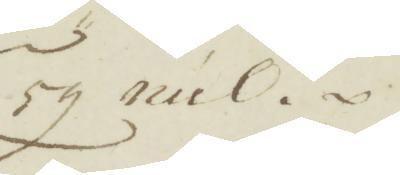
59 nul.
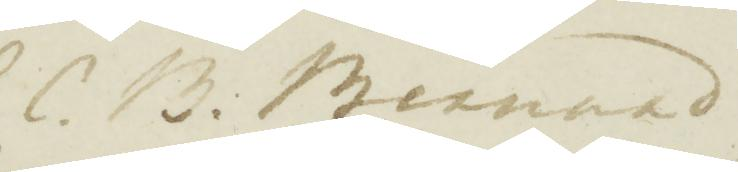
I.C.B. Bernard
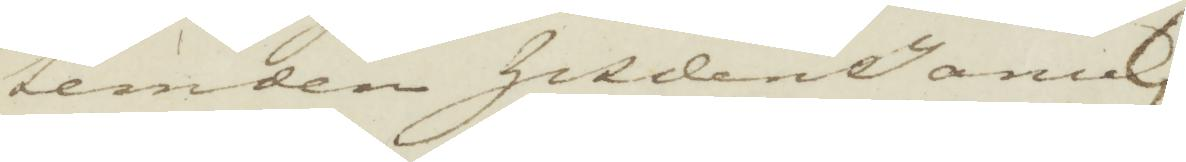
lem den Zesden Ianu
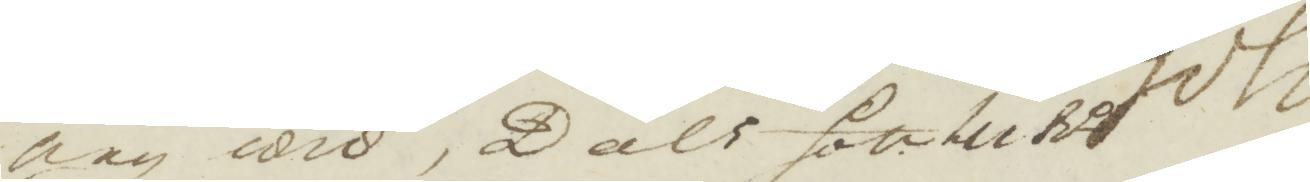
ary 1828, D als fol, 41 R-o
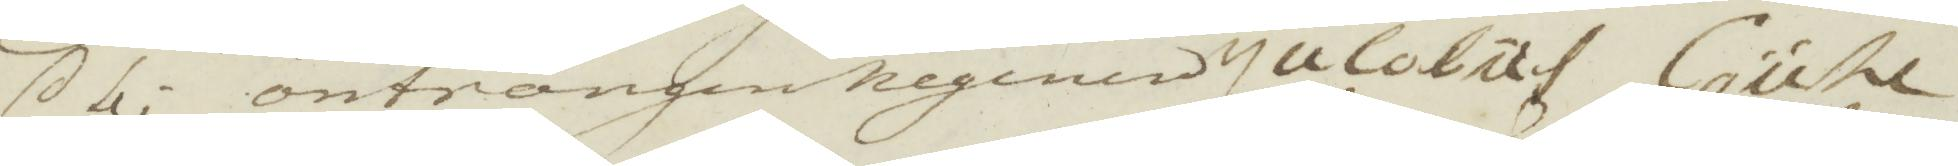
C4: ontvangen negenen Jacobus Coule
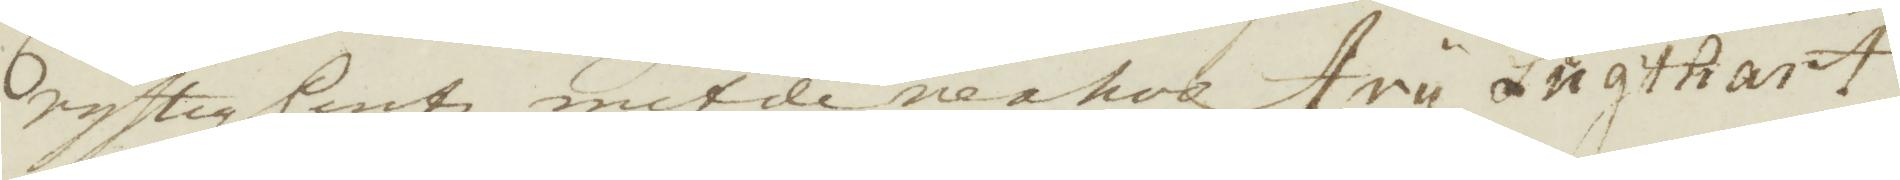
vyftig Cents met de verho Arij Lugthart
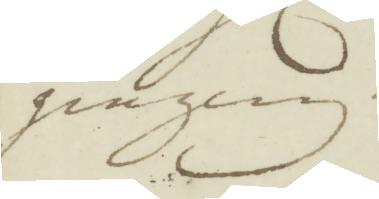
gingen.
